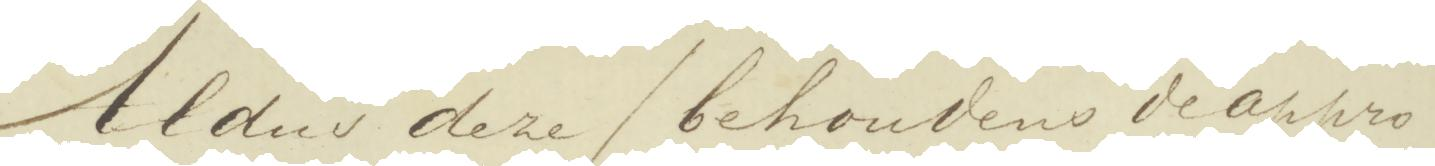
Aldus deze / behoudens de appro
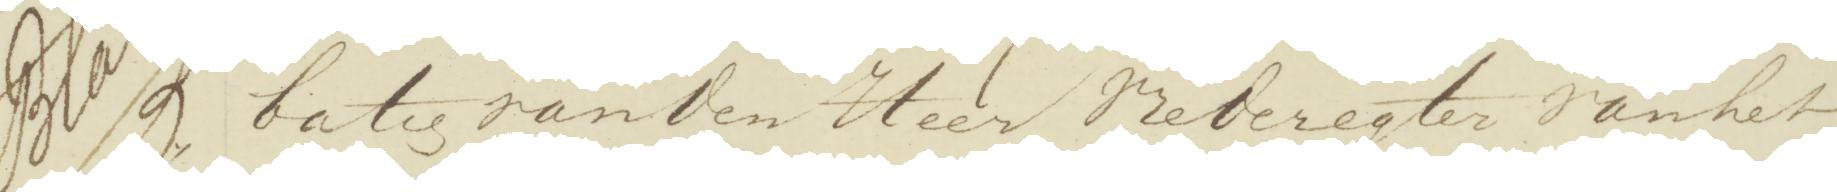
batie van den Heer Vrederegter van het
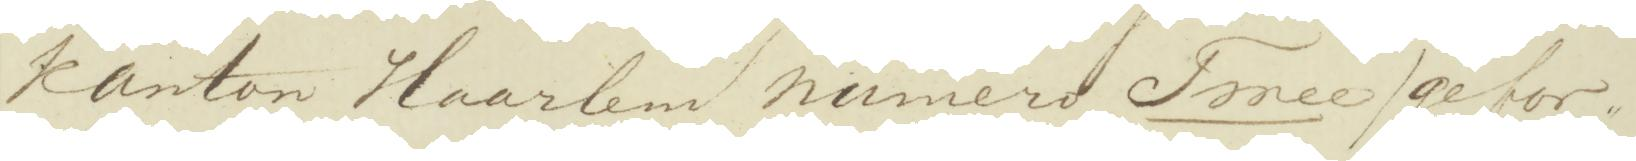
kanton Haarlem numero Twee / gefor„
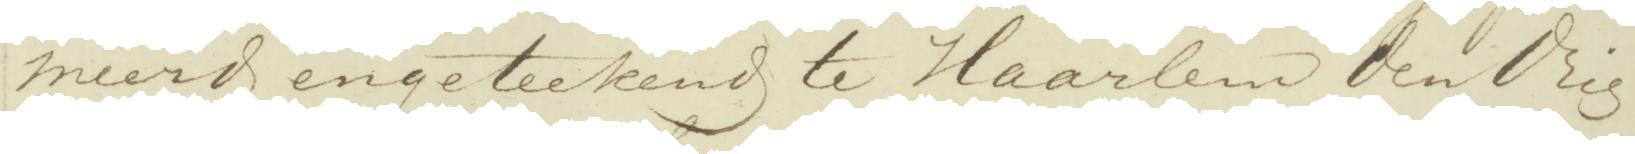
meerd en geteekend te Haarlem den drie
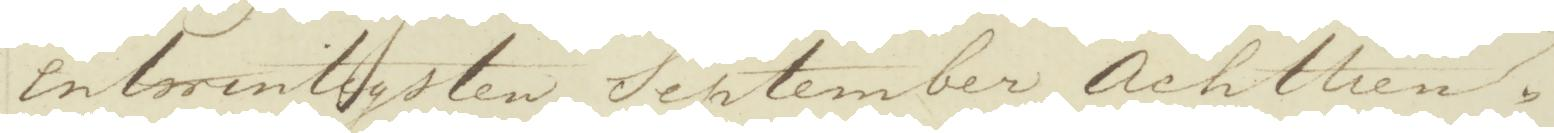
en twintigsten September achttien„
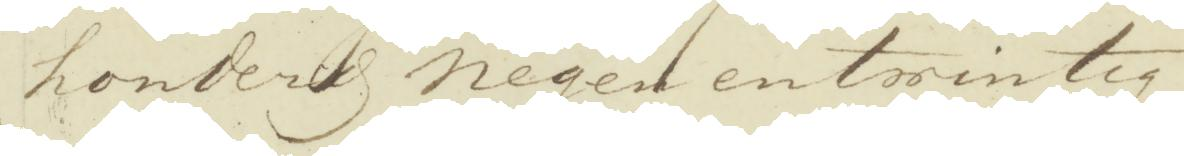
honderd negen en twintig.
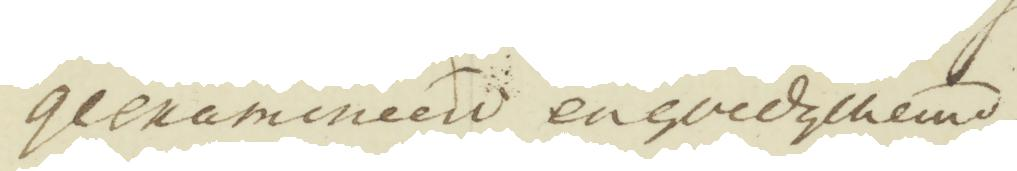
geexamineerd en goedgekeurd
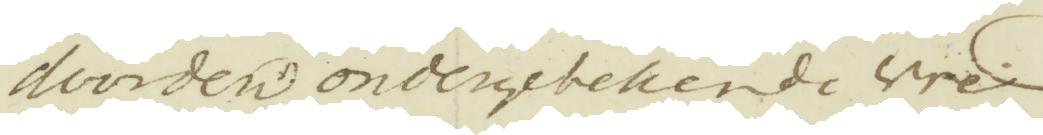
door den ondergetekende vre
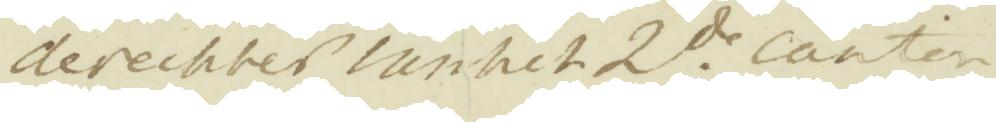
derechter van het 2.de canton
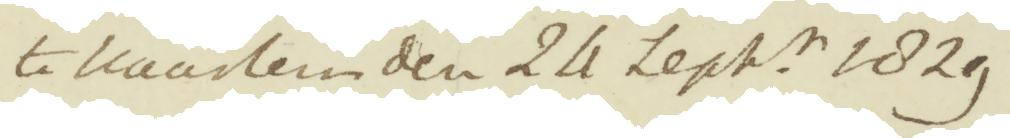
te Haarlem den 24 sept.r 1829
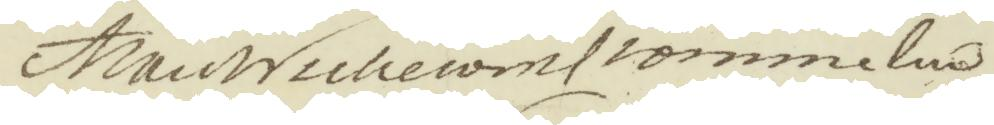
A van Wickevoort Crommelin
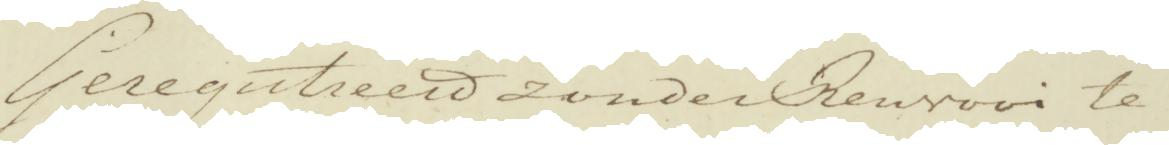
Geregistreerd zonder Renvooi te
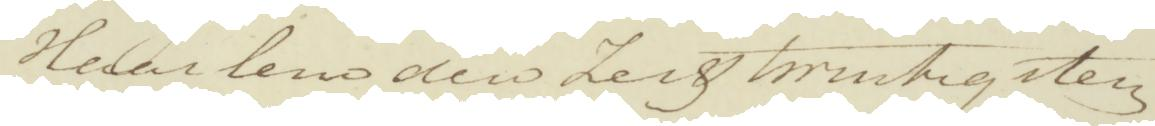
Haarlem den zes & twintigsten
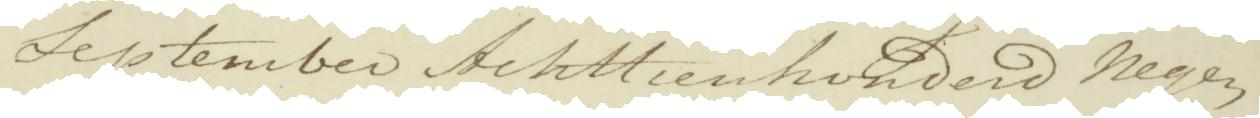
September Achttienhonderd negen
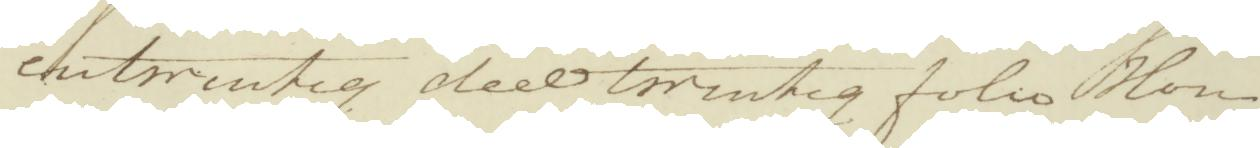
entwintig deel twintig folio Hon
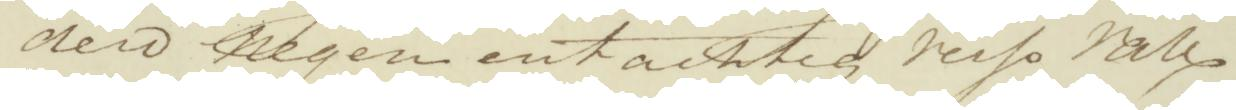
derd negen entachtig verso vak
